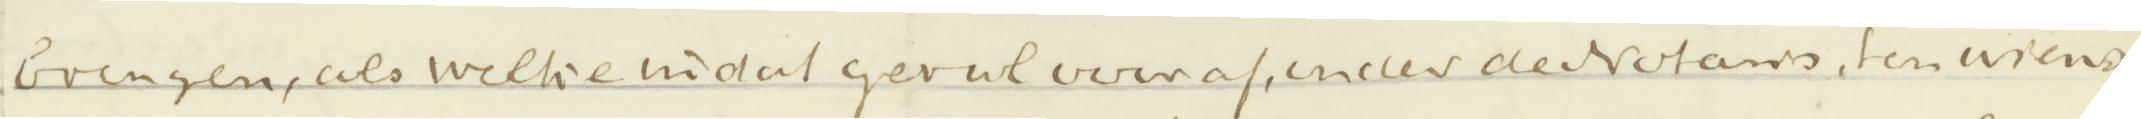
brengen, als welke in dat geval vooraf, onder de Notaris, ten wiens
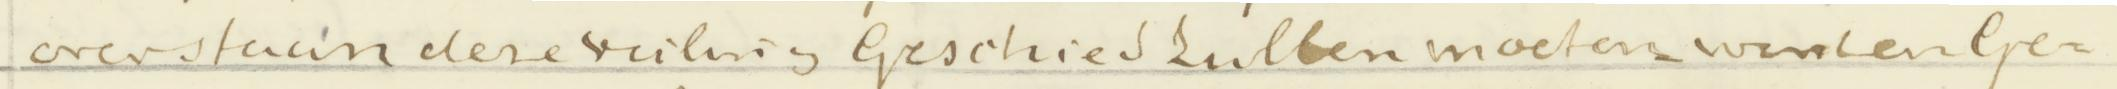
overstaan deze veiling geschied zullen moeten worden Ge=
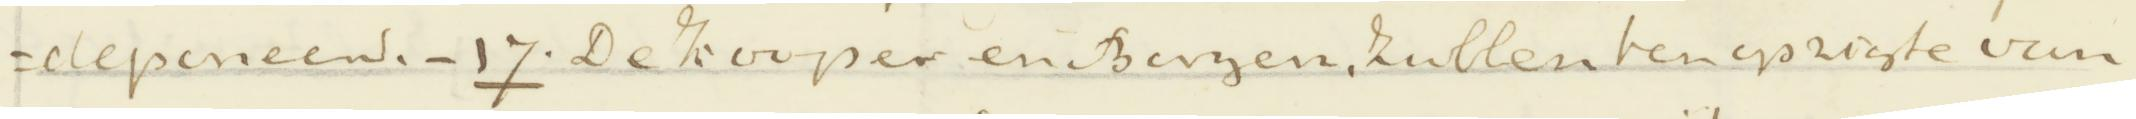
=deponeerd. – 17. De Kooper en Borgen, zullen ten opzigte van
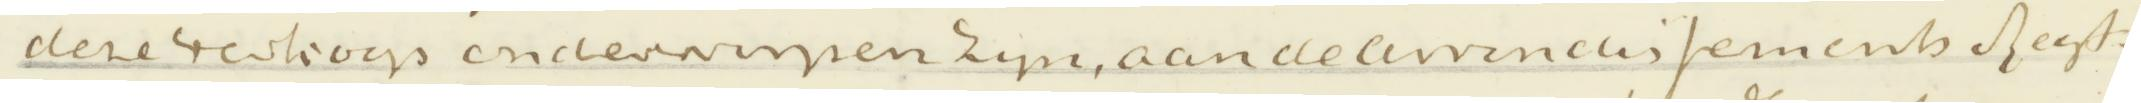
deze verkoop onderworpen zyn, aan de arrondissements Regt-
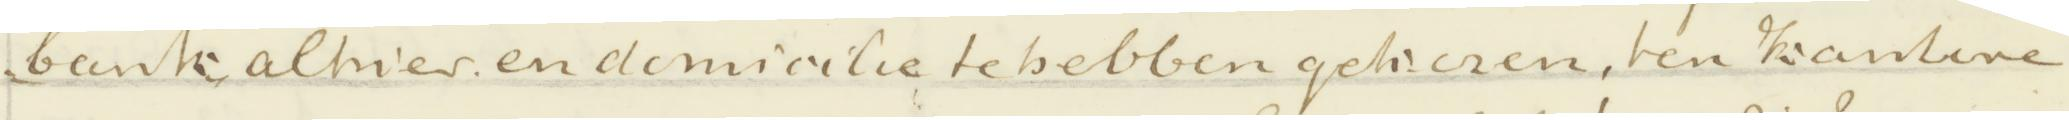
=bank alhier, en domicilie te hebben gekozen, ten kantore
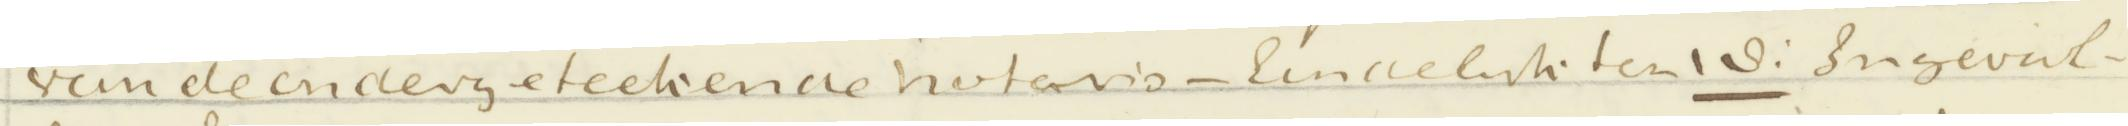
van de ondergeteekende notaris – Eindelyk ten 18: Ingeval-
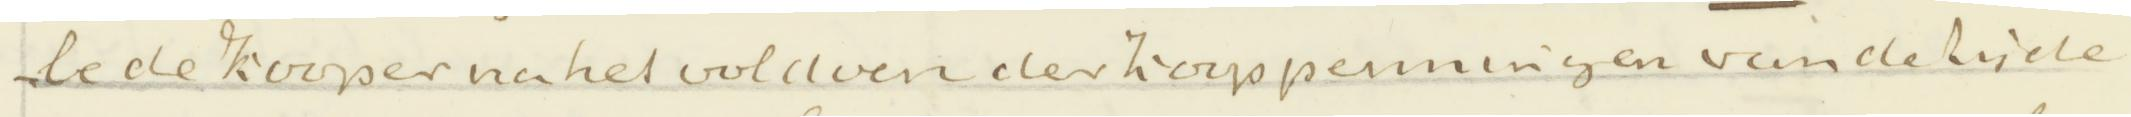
-le de kooper na het voldoen der kooppenningen van de zijde
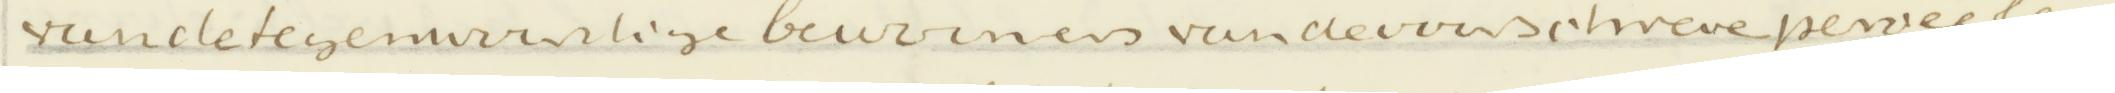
van de tegenwoordige bewooners van de voorschreve perceelen
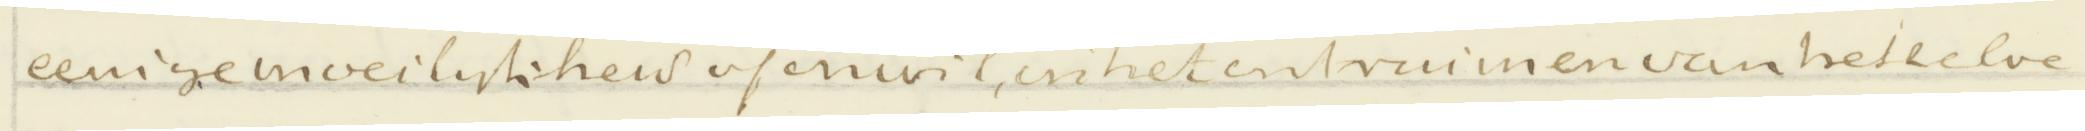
eenige moeilykheid of onwil, in het ontruimen van hetzelve
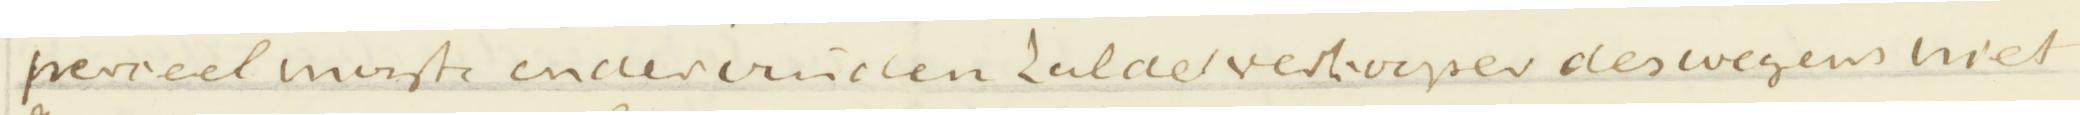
perceel mogte ondervinden zal de verkooper des wegens niet
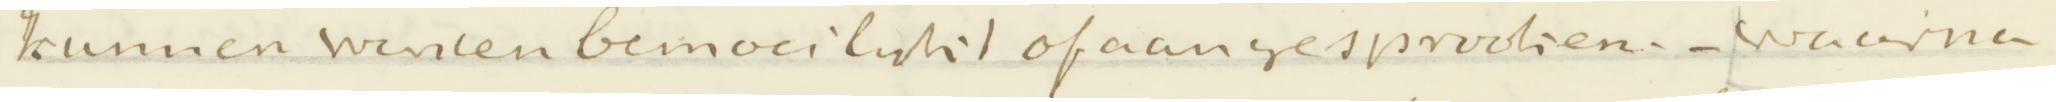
kunnen worden bemoeilykt of aangesprooken. – waarna
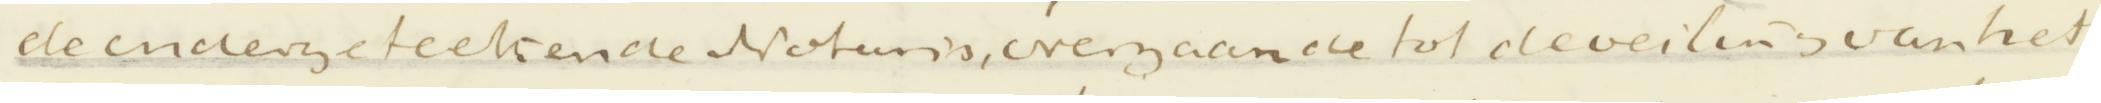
de ondergeteekende Notaris, overgaande tot de veiling van het
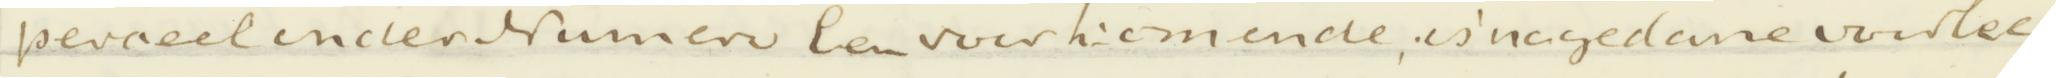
perceel onder Numero Een voorkomende, is nagedane voorlee
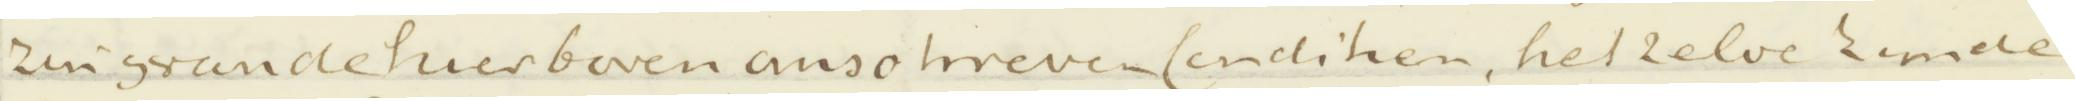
zing van de hierboven omschreven Conditien, het zelve zynde
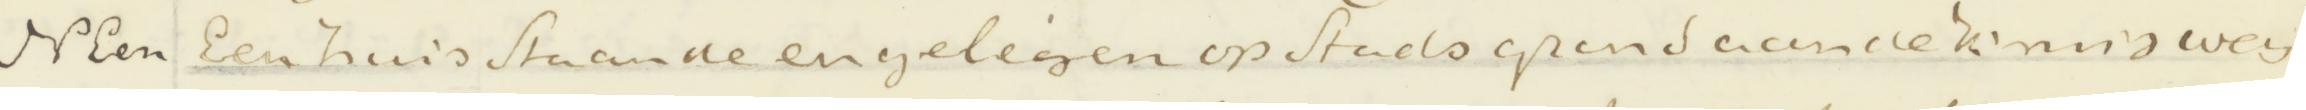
N Een Een huis staande en gelegen op stads grond aan de kruisweg
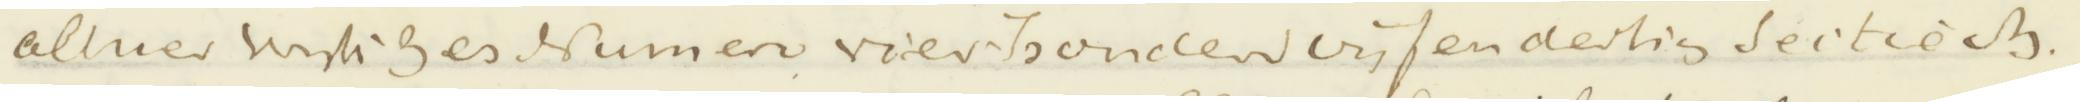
alhier wyk zes Numero vier honderd vijf en dertig sectie B.
